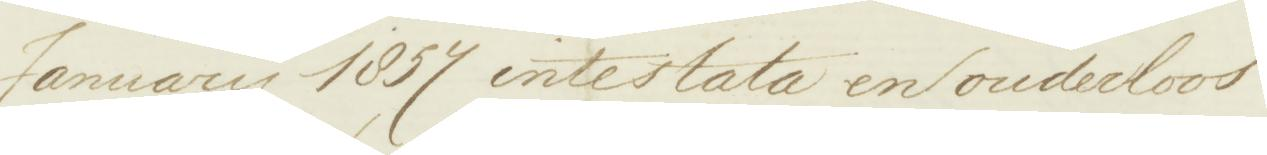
Januarij 1857 intestato en ouderloos
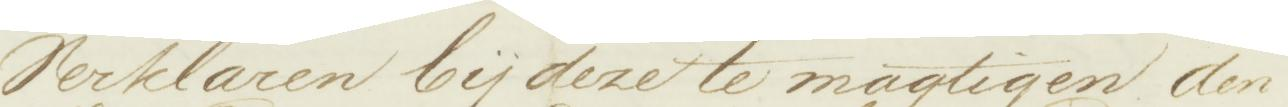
Verklaren bij deze te magtigen den
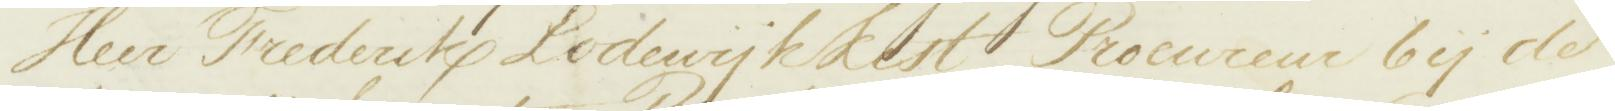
Heer Frederik Lodewijk Kist Procureur bij de
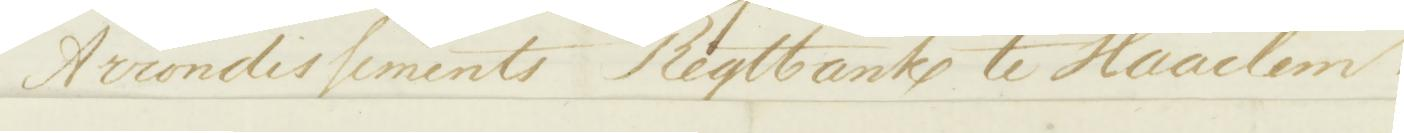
Arrondissements Regtbank te Haarlem.
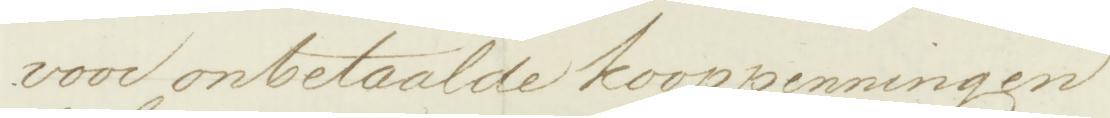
voor onbetaalde kooppenningen
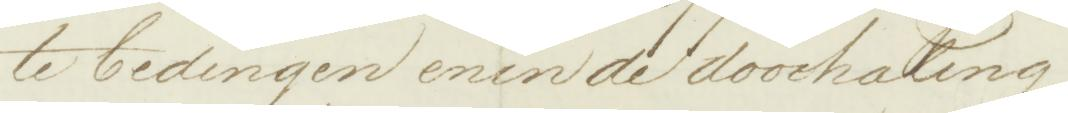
te bedingen en in de doorhaling
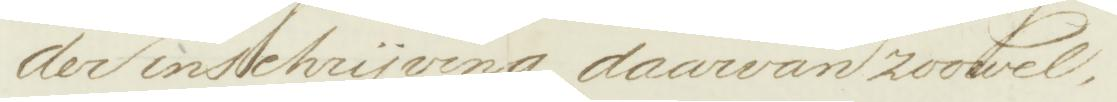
der inschrijving daarvan zoowel,
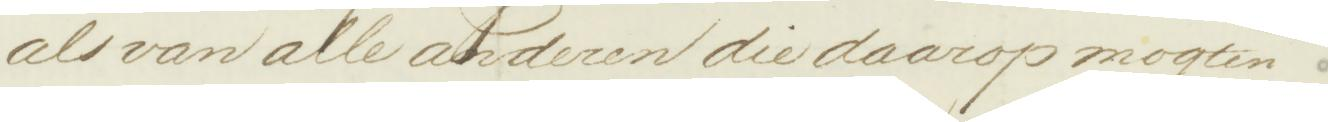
als van alle anderen die daarop mogten
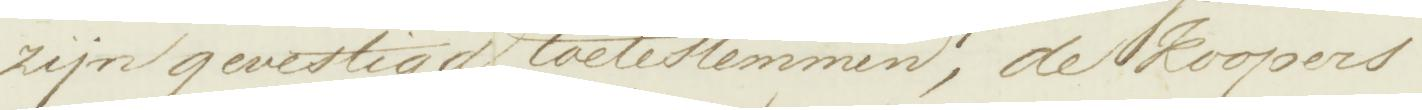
zijn gevestigd toetestemmen, de Koopers
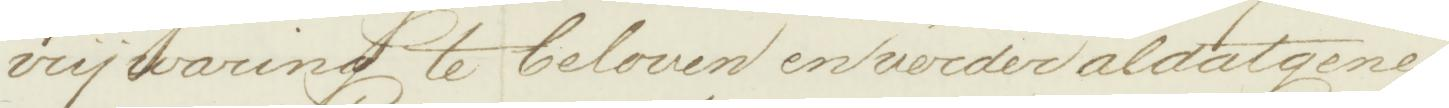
vrijwaring te beloven en verder al datgene
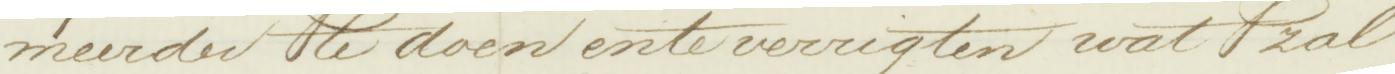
meerder te doen en te verrigten wat zal
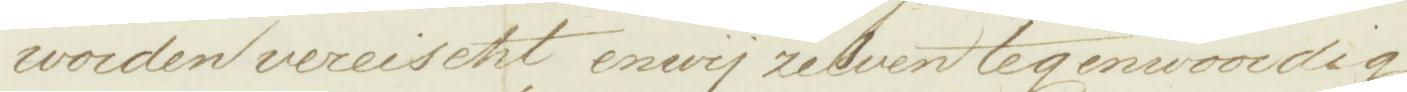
worden vereischt en wij zelven tegenwoordig
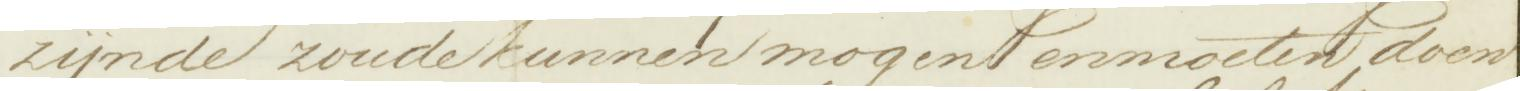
zijnde zoude kunnen mogen en moeten doen
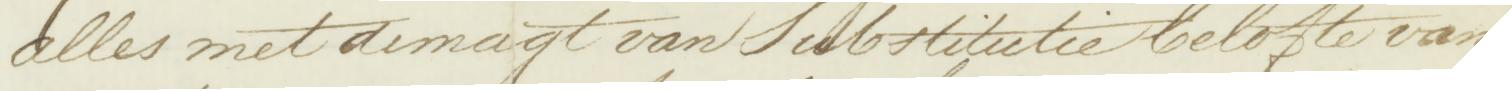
alles met de magt van substitutie belofte van
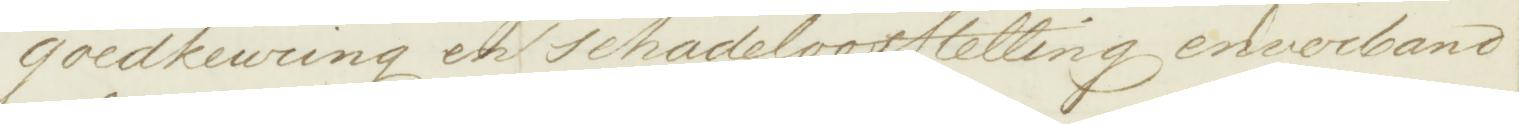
goedkeuring en schadeloosstelling en verband
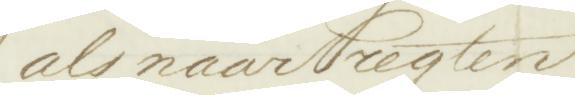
als naar regten
